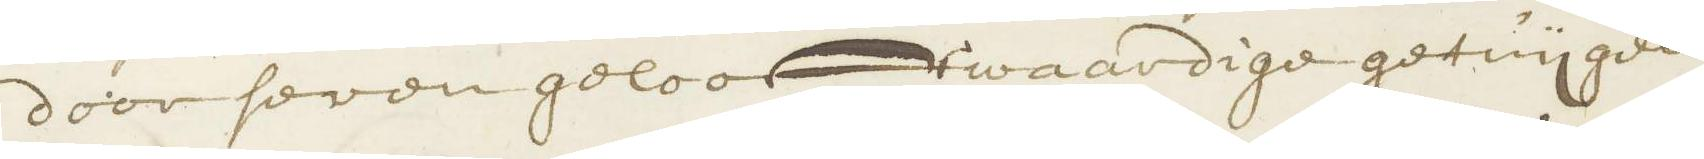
door seven gelooffwaardige getuijgen
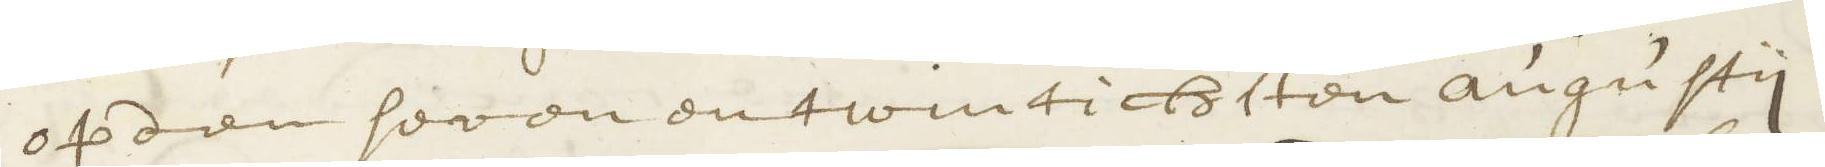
op den seven en twintichsten augustij
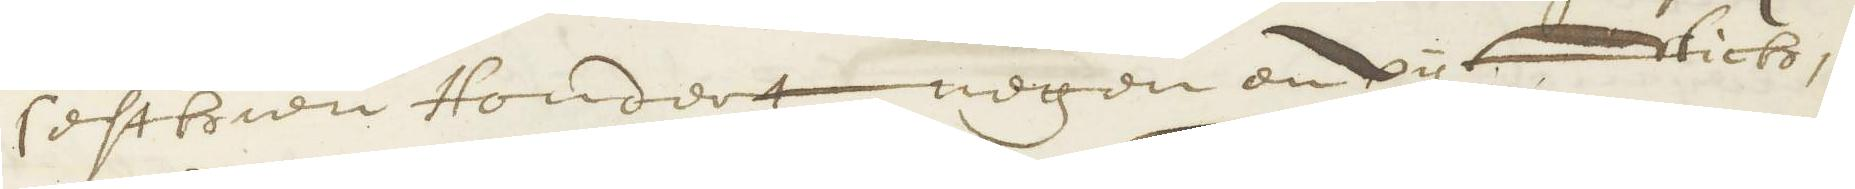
sesthien Hondert negen en vijfftich,
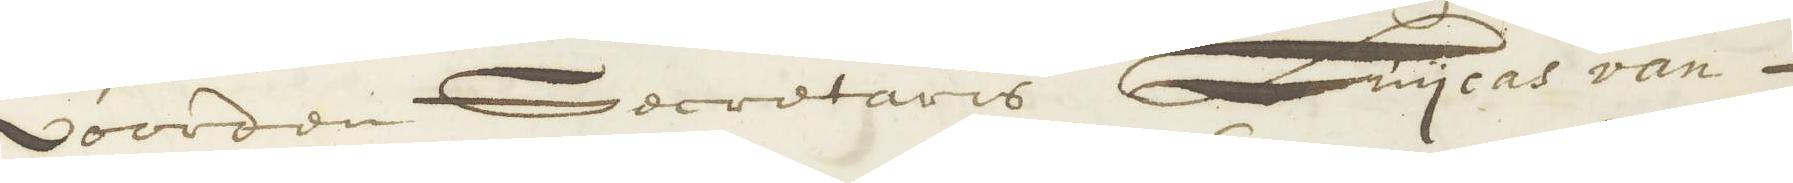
voorden Secretaris Luijcas van
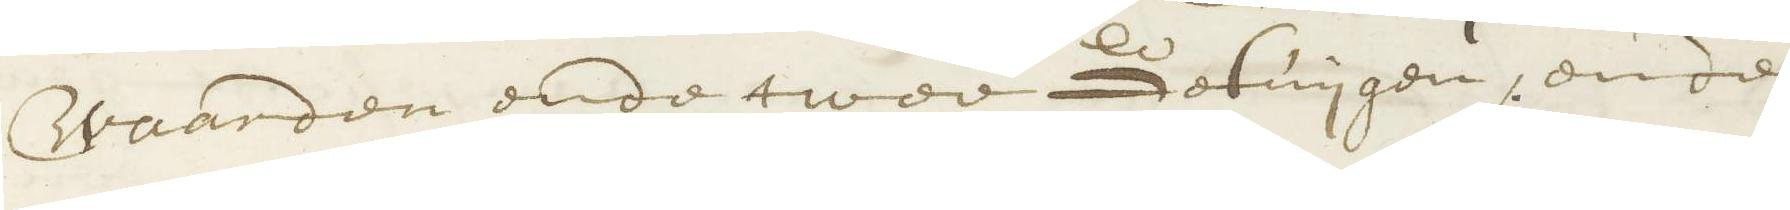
Waarden ende twee Getuijgen, ende
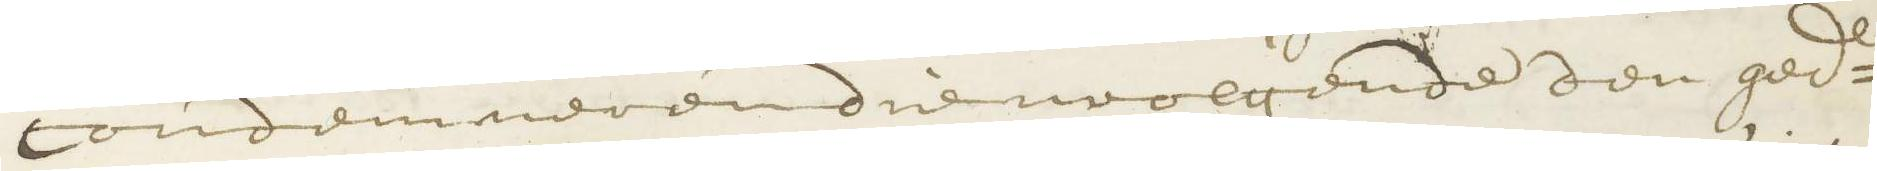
condemneren dienvolgende den ged=e
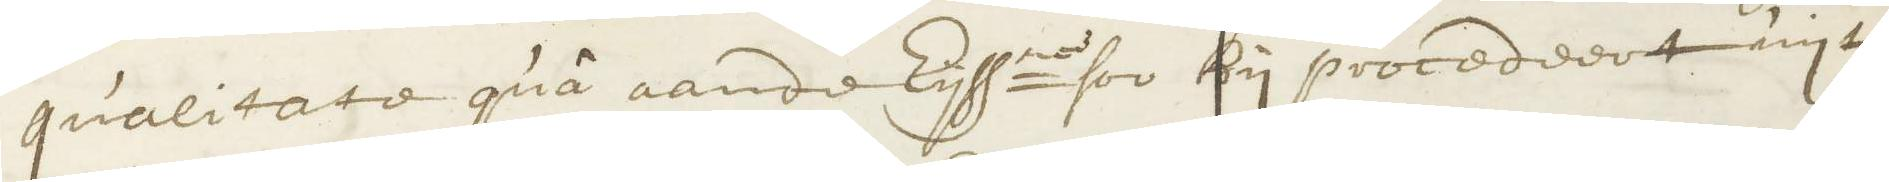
qualitate quâ aande Eijss=rce soo sij procedeert uijt
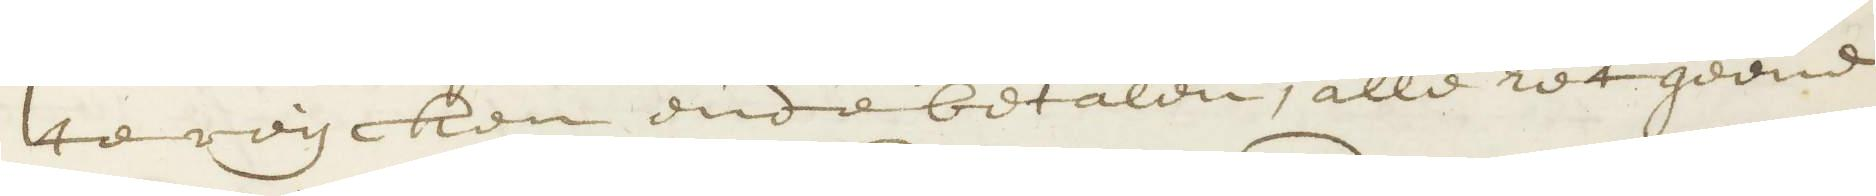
te reijcken ende betalen, alle het geene
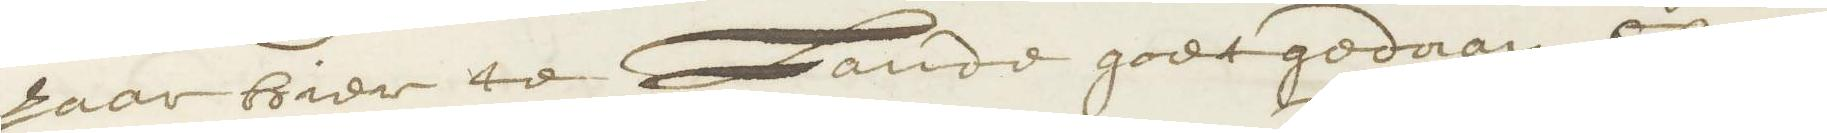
haar hier te Lande goet gedaan can
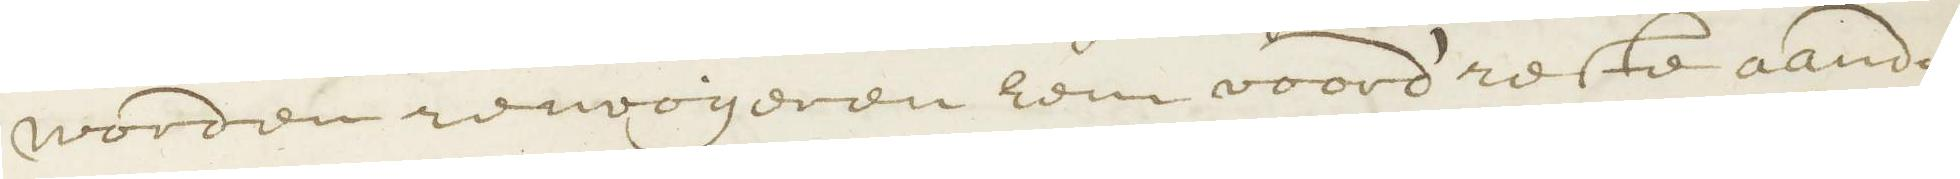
worden renvoijeren hem voord’reste aande
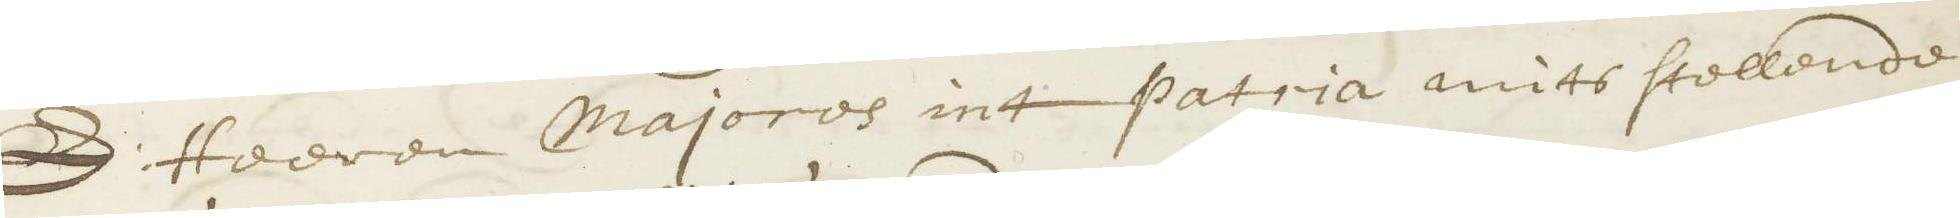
E: Heeren majores int patria mits stellende
